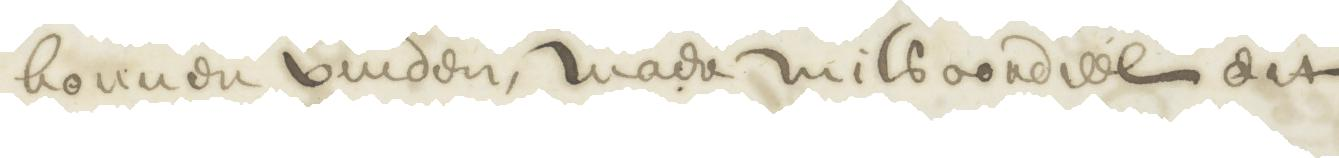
konnen vinden, maer mits oordeel dit
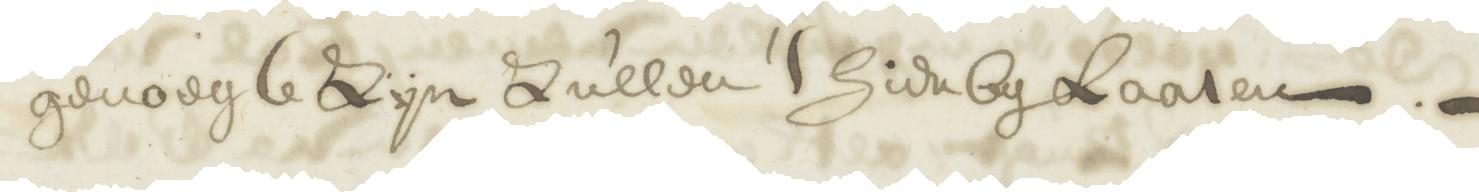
genoeg te zijn zullen ’t hier bij Laaten. —
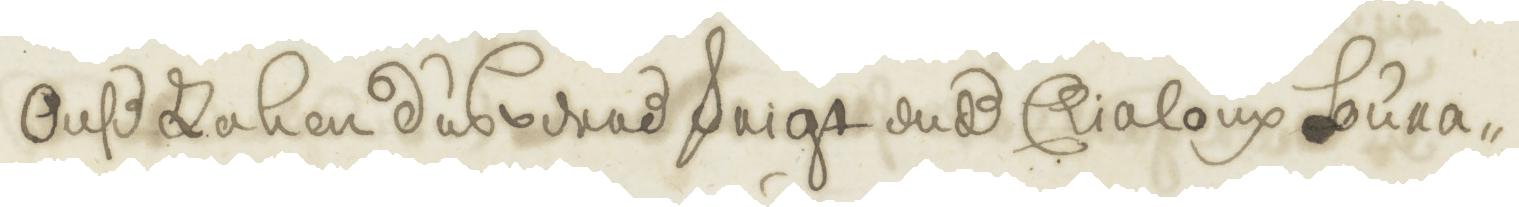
Onse zaken dusverre verrigt en de Chialoup Soura„
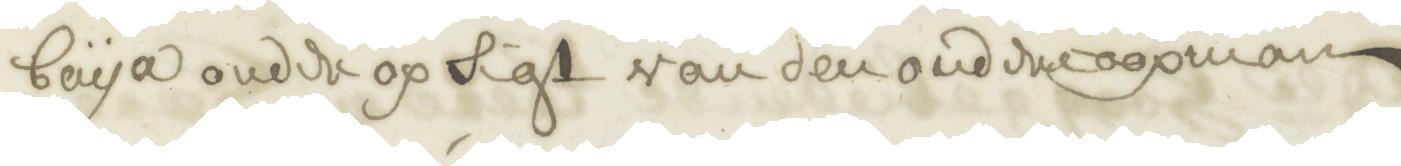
baija onder op sigt van den ondercoopman
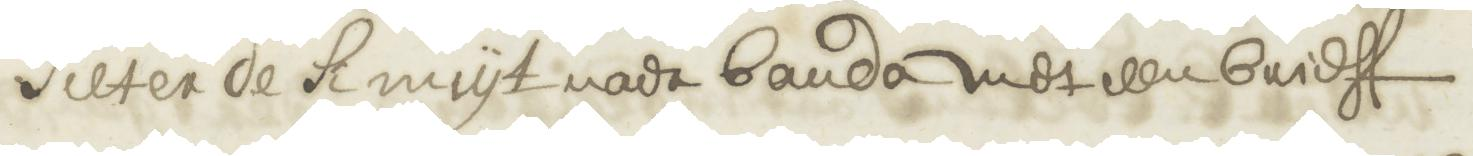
Pieter de kruijt naer banda met een brieff
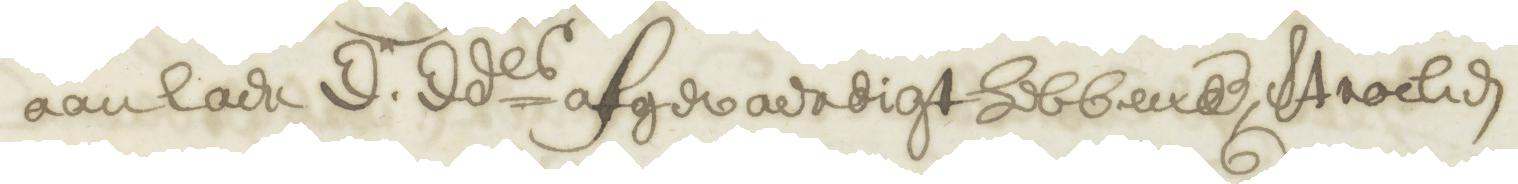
aan haer E. Ed=ls afgevaerdigt hebbende, vertrocken
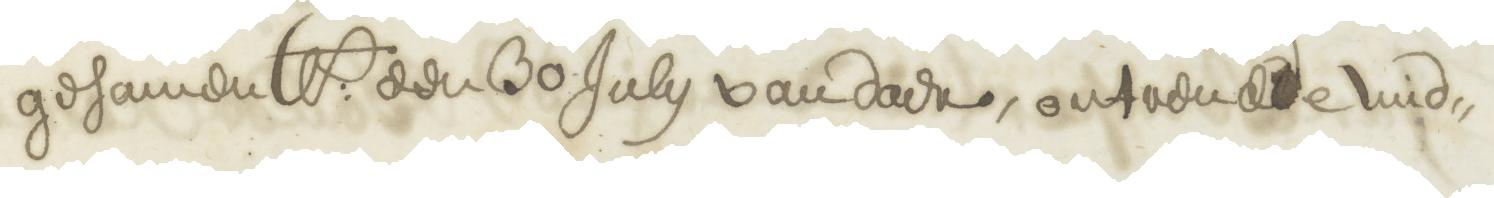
gesamentlijk den 30: July van daer, ontrend de mid„
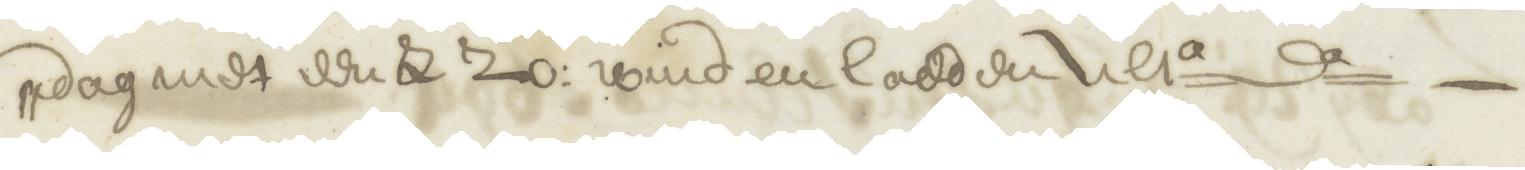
„dag met een z zo: wind en hadden ult=o _=o
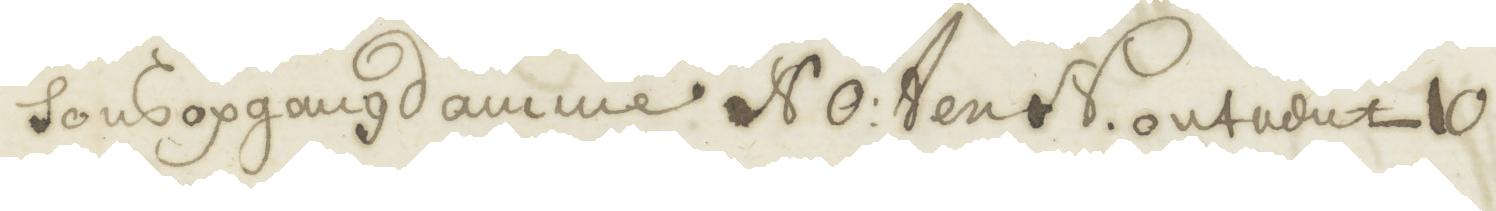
sonsopgang damme NO: ter N. ontrent 10
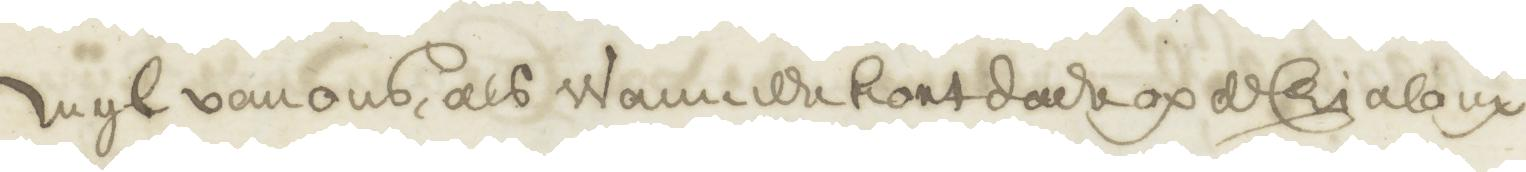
myl van ons, als wanneer kort daer op de Chialoup
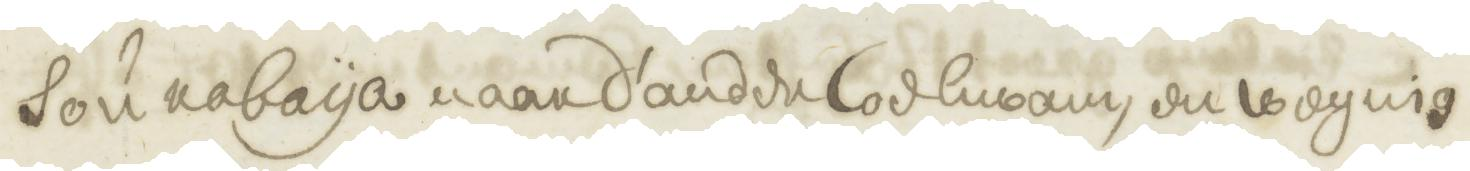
Sourabaija naar d'ander toekwam, en weynig
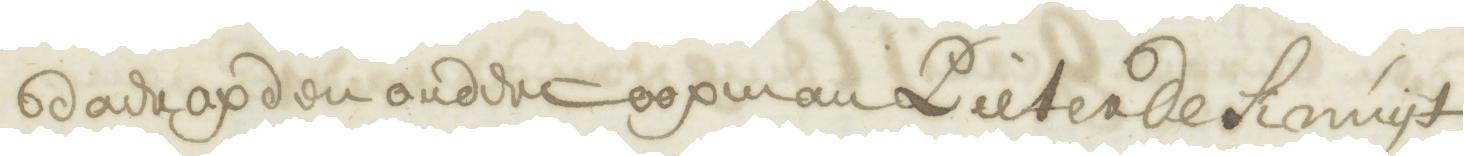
daer op den onder coopman Pieter de kruijt
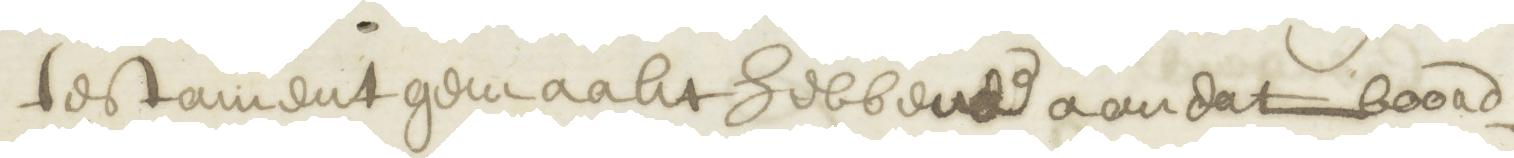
testament gemaakt hebbende aan dat boord
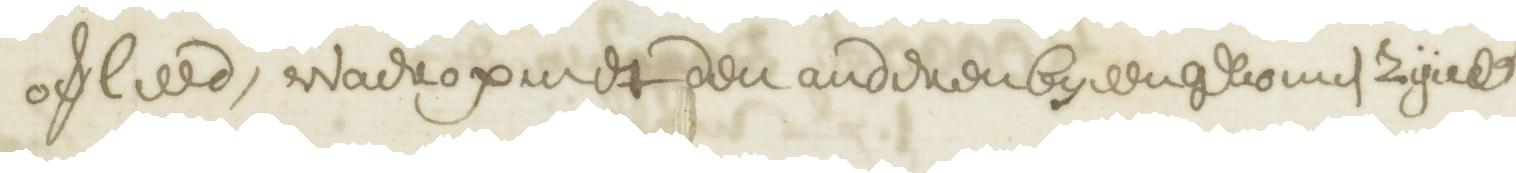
overleed, waerop met den anderen bij een gekomen zijnde
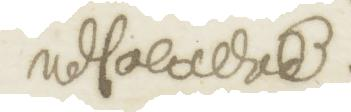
resolveerde
